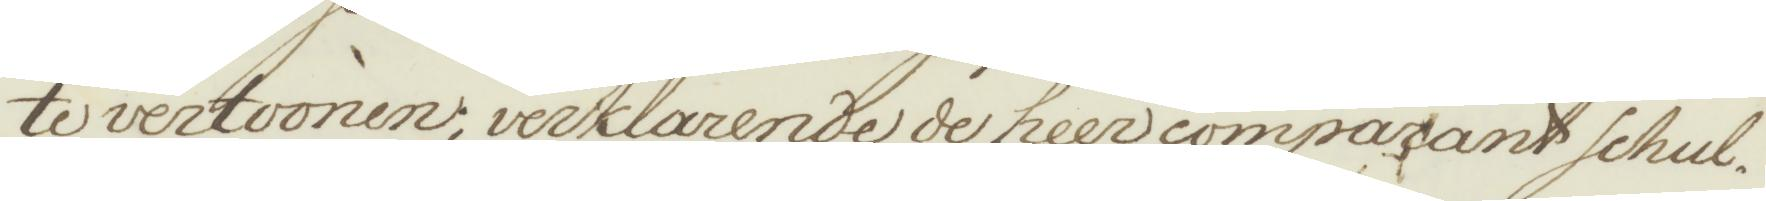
te vertoonen, verklarende de heer comparant schul„
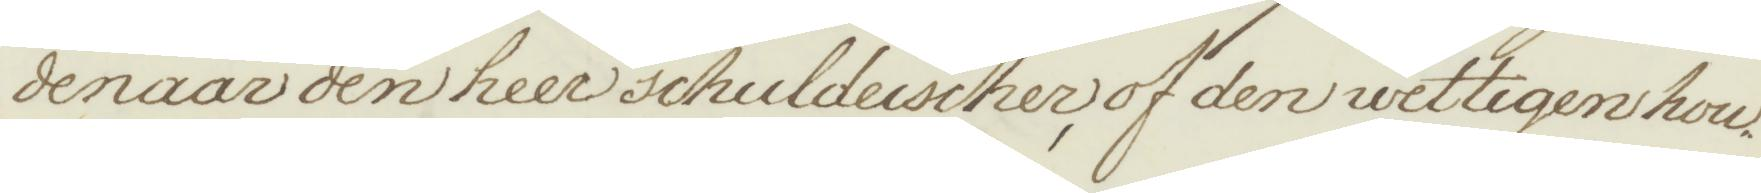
denaar den heer schuldeischer, of den wettigen hou„
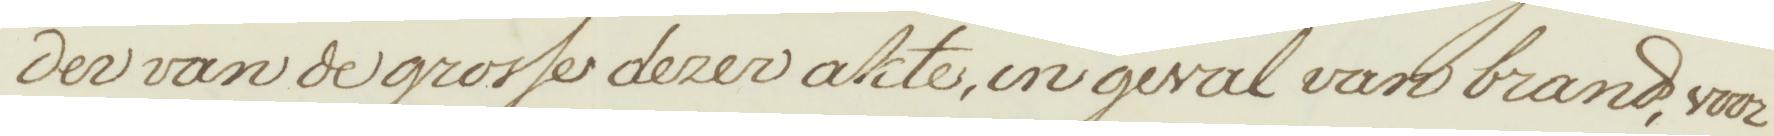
der van de grosse dezer akte, in geval van brand, voor
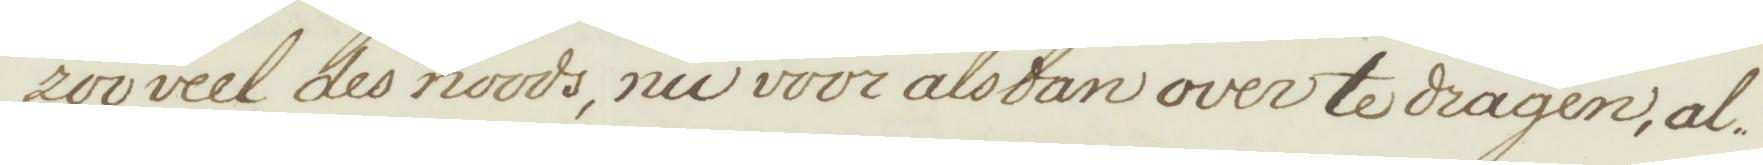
zoo veel des noods, nu voor als dan over te dragen, al„
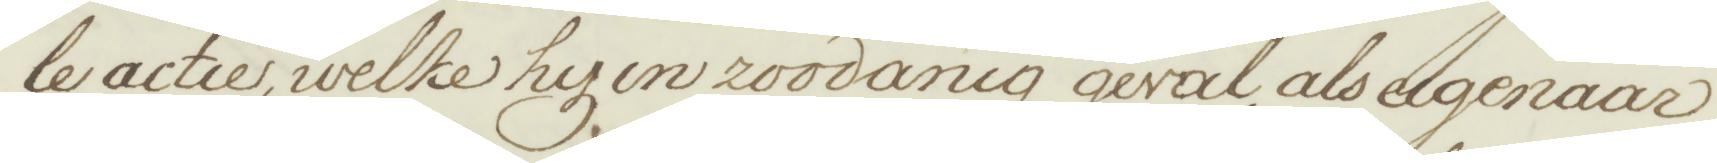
le actie, welke hij in zoodanig geval, als eigenaar
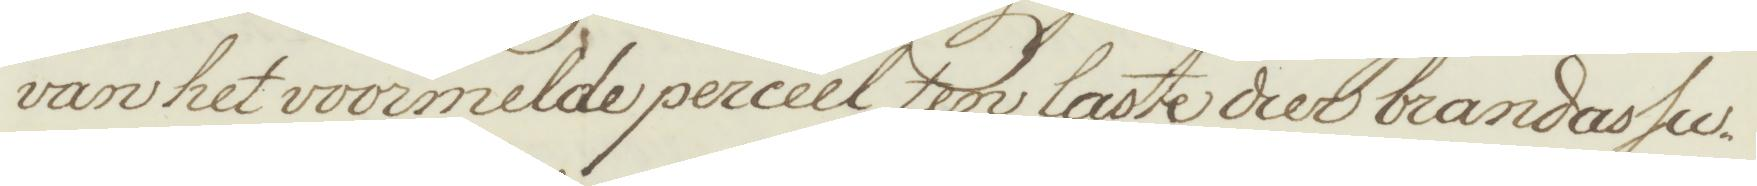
van het voormelde perceel ten laste dier brandassu„
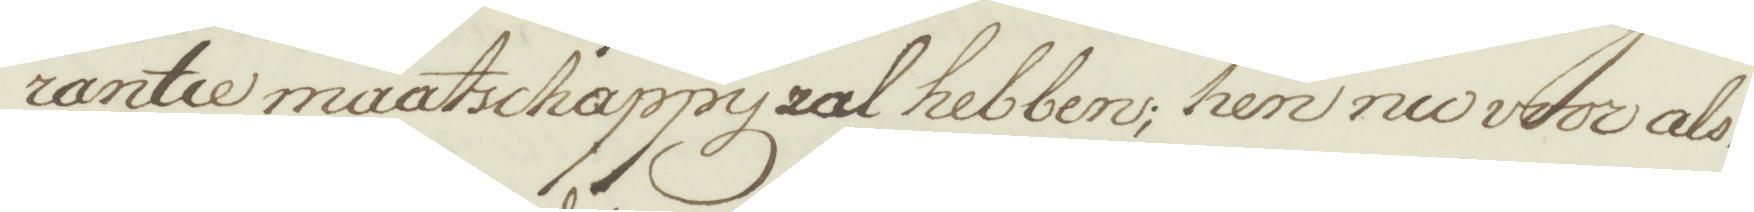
rantie maatschappy zal hebben; hen nu voor als„
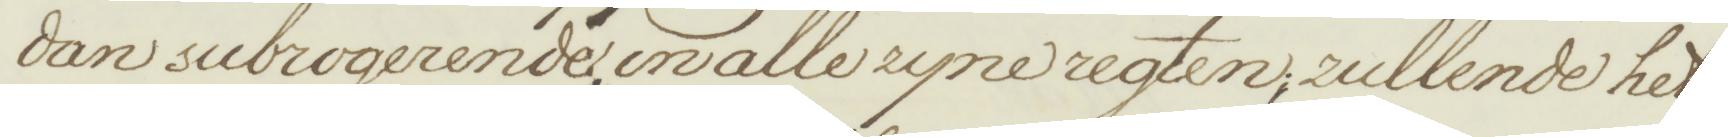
dan subrogerende, in alle zyne regten; zullende het
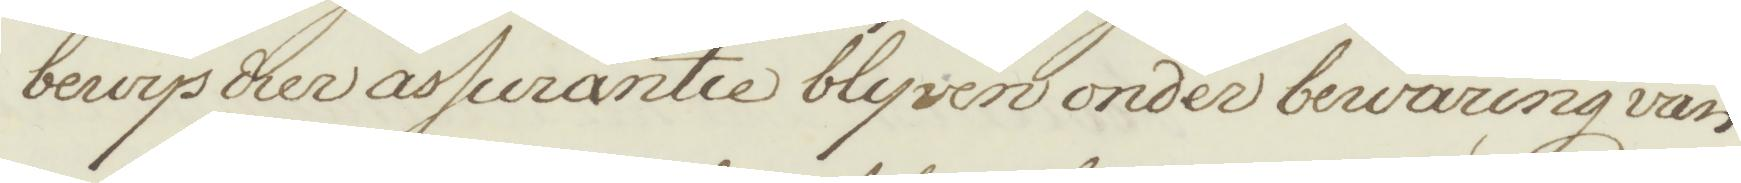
bewijs dier assurantie blyven onder bewaring van
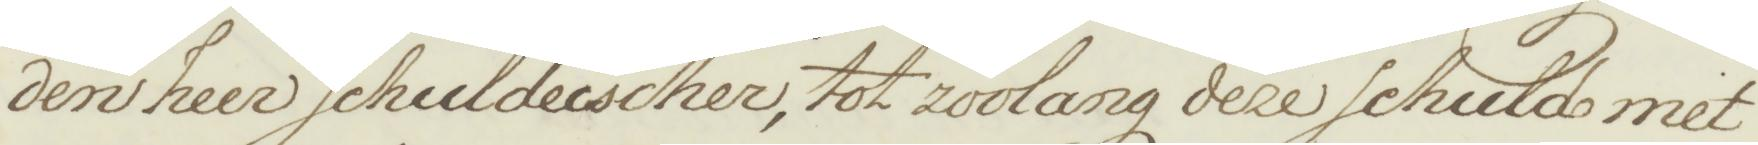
den heer schuldeischer, tot zoolang deze schuld met
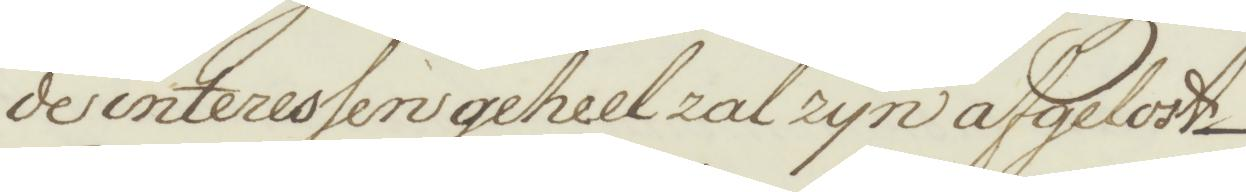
de interessen geheel zal zyn afgelost—
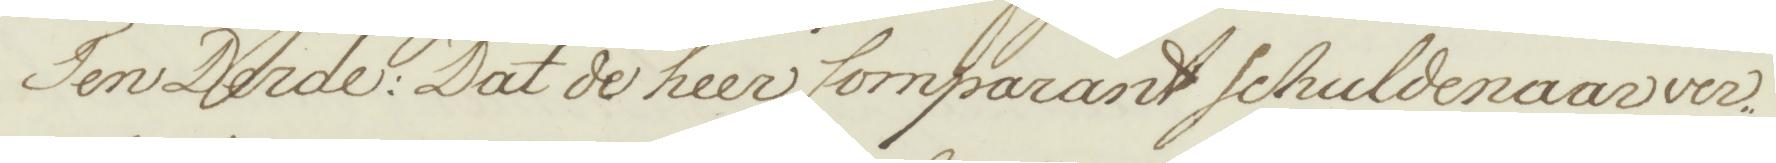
Ten Derde: Dat de heer Comparant schuldenaar ver„
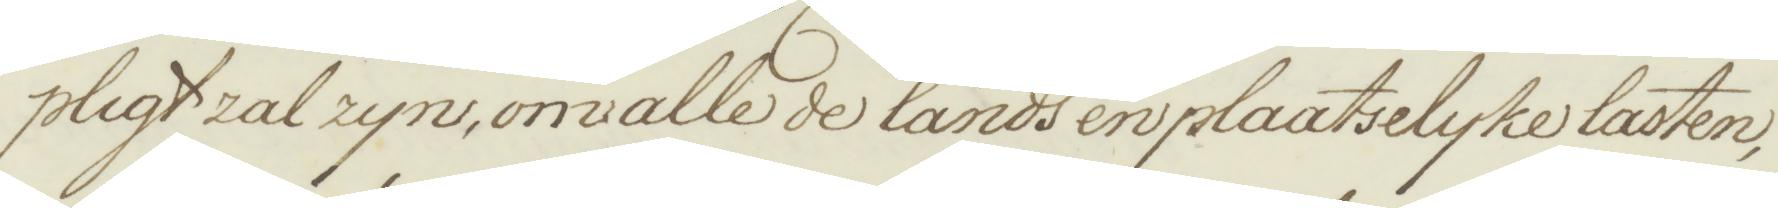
pligt zal zyn, om alle de lands en plaatselijke lasten,
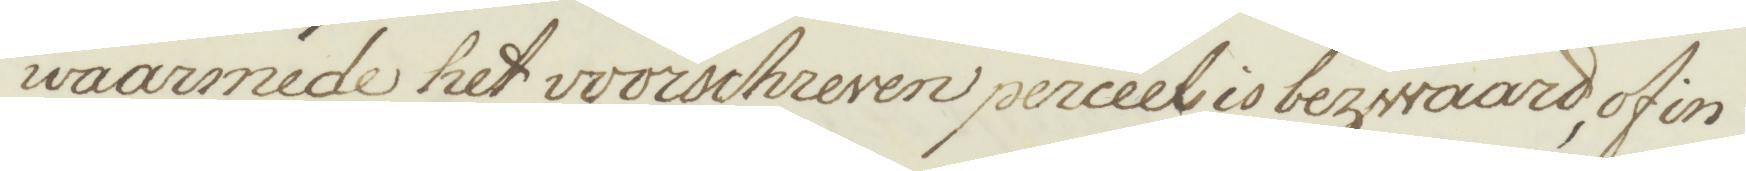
waarmede het voorschreven perceel is bezwaard, of in
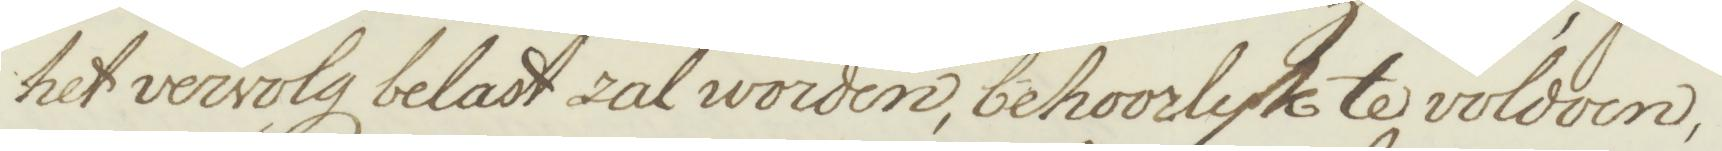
het vervolg belast zal worden, behoorlyk te voldoen,
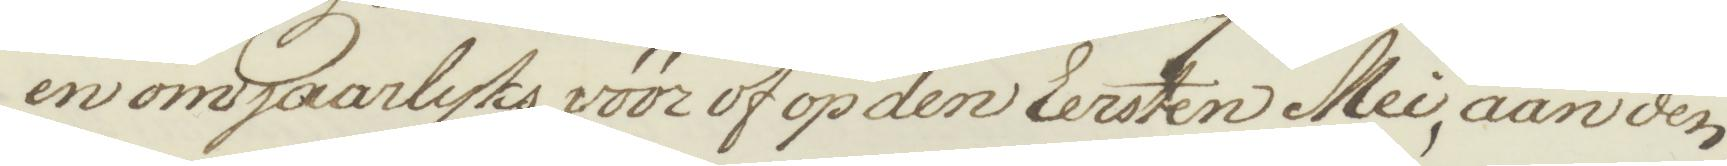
en om jaarlyks, vóór of op den Eersten Mei, aan den
